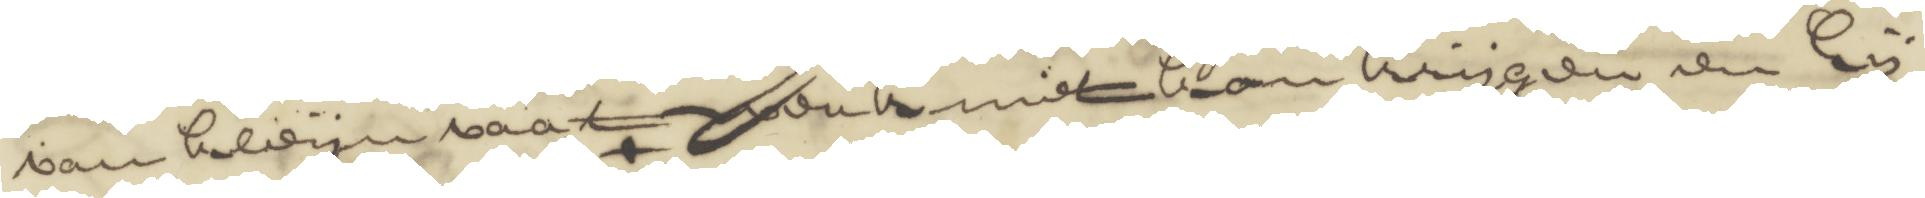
van kleijn vaatwerk niet kon krijgen en hij
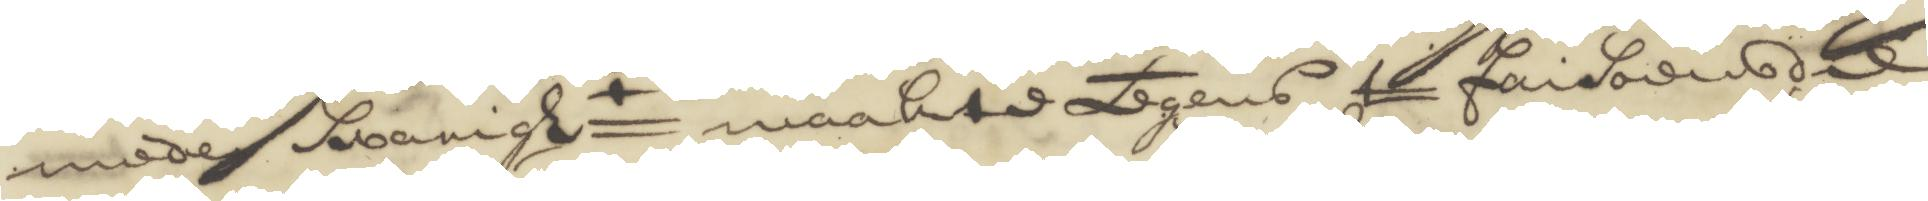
mede swarigh=t maakte tegens 't faisoens de
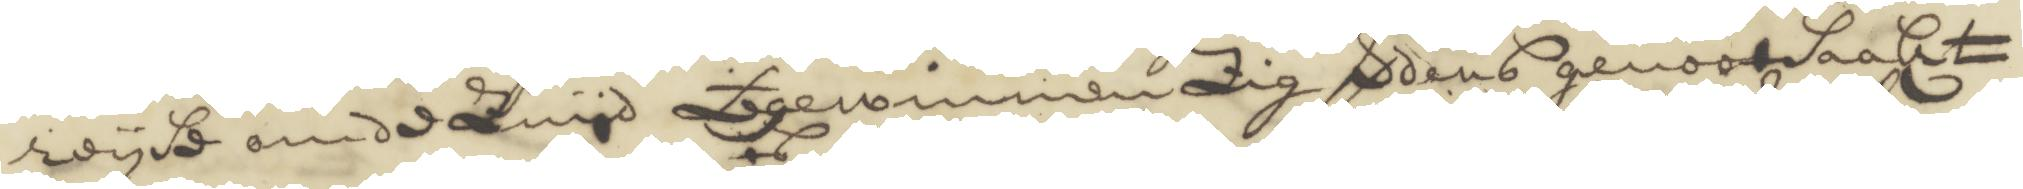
reijse om de Zuijd te gewinnen Zig verders genootsaakt
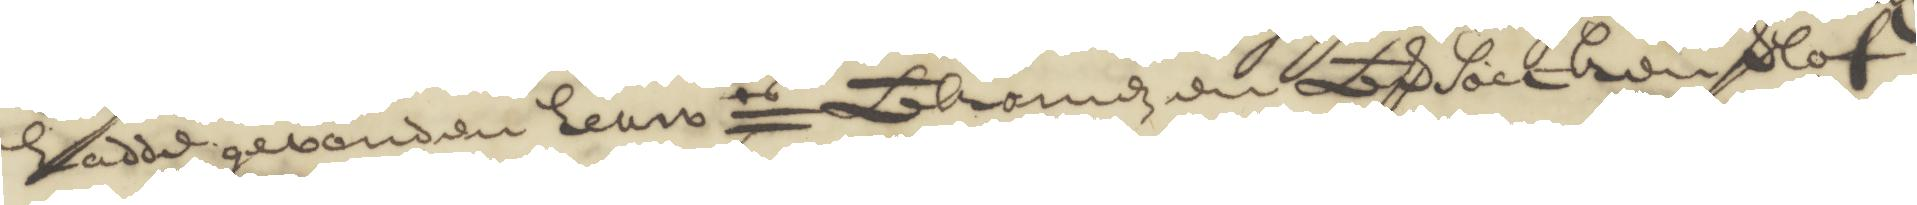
hadde gevonden herw=ts te komen en te versoecken verlof
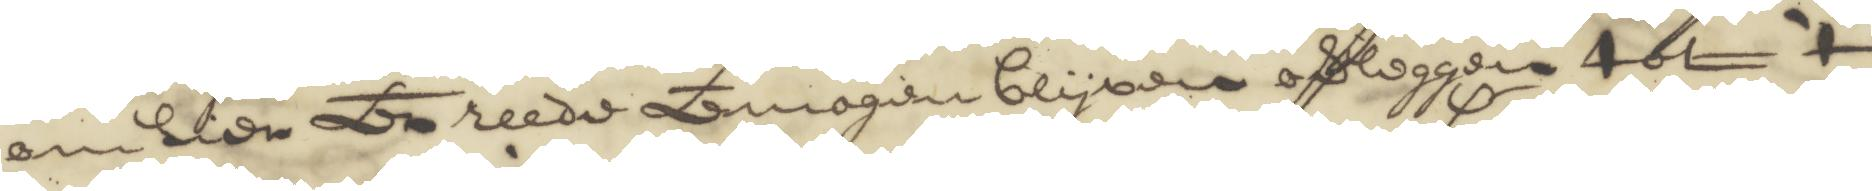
om hier ter reede te mogen blijven overleggen tot ’t
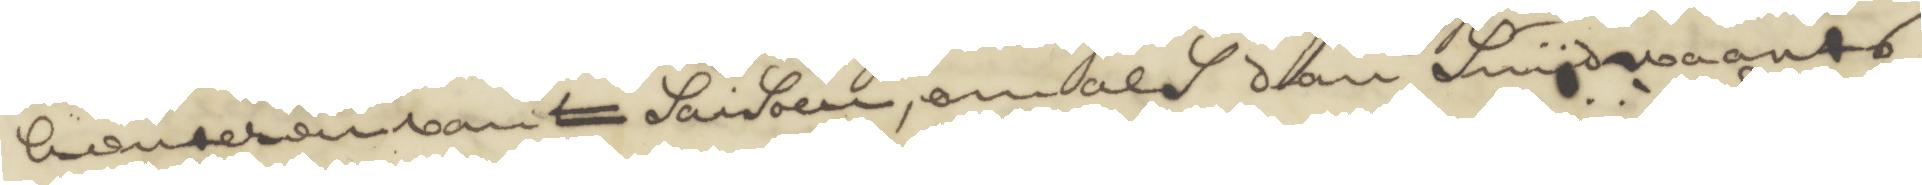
kenteren van ’t Saisoen, om als dan Suijdwaarts
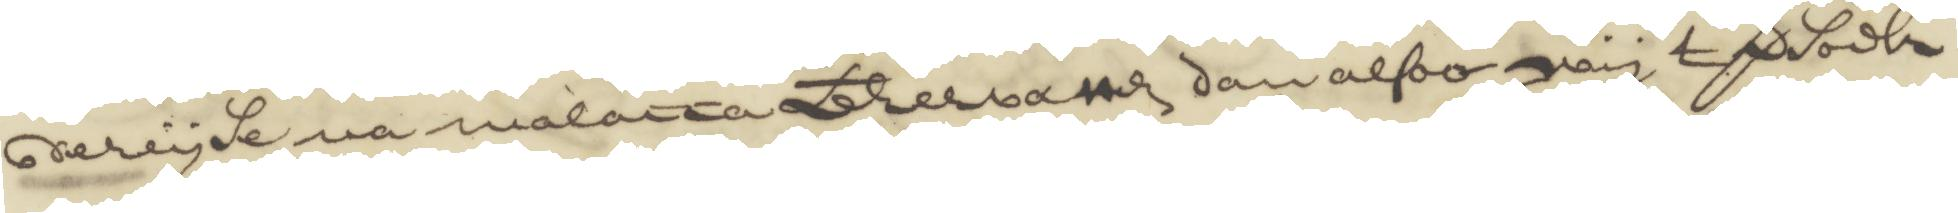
de reijse na malacca te hervatten dan alsoo wij ’t versoek
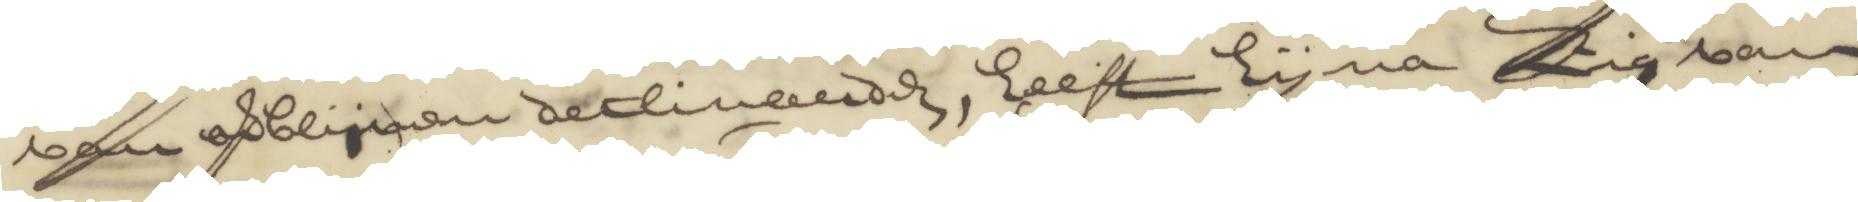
van overblijven declineerden, heeft hij na Zig van
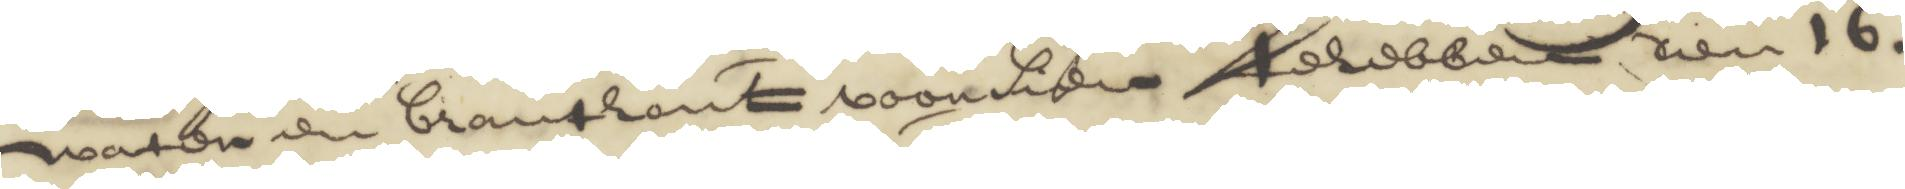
water en branthout voorsien te hebben den 16.
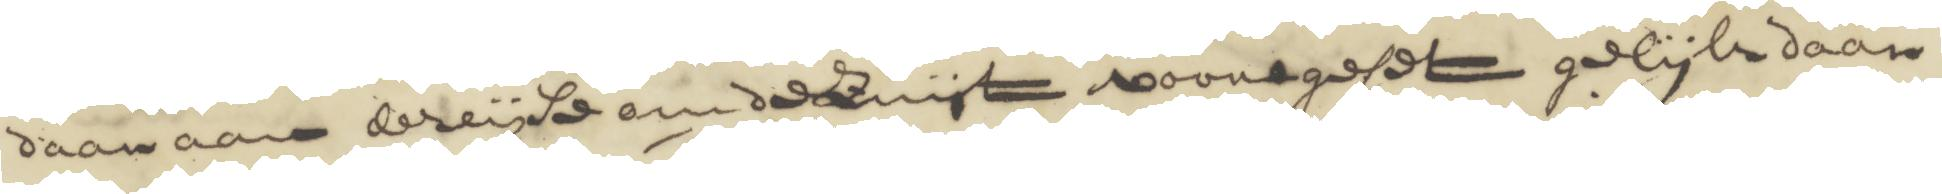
daar aan de reijse om de zuijt voortgeset gelijk daar
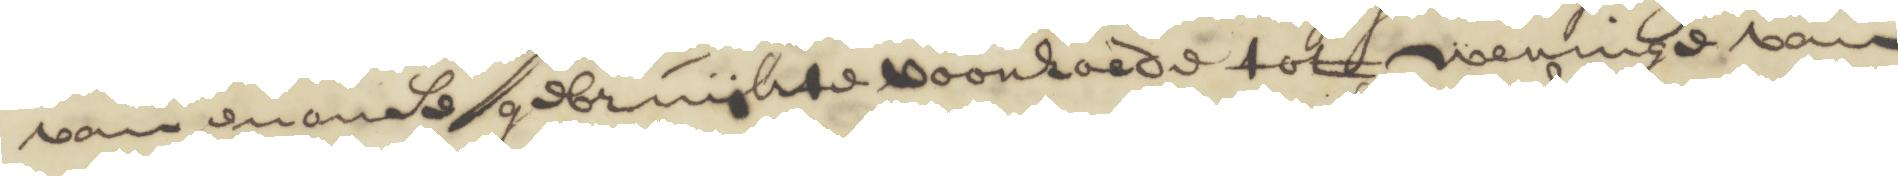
van en onse gebruijkte voorhoede tot weringe van
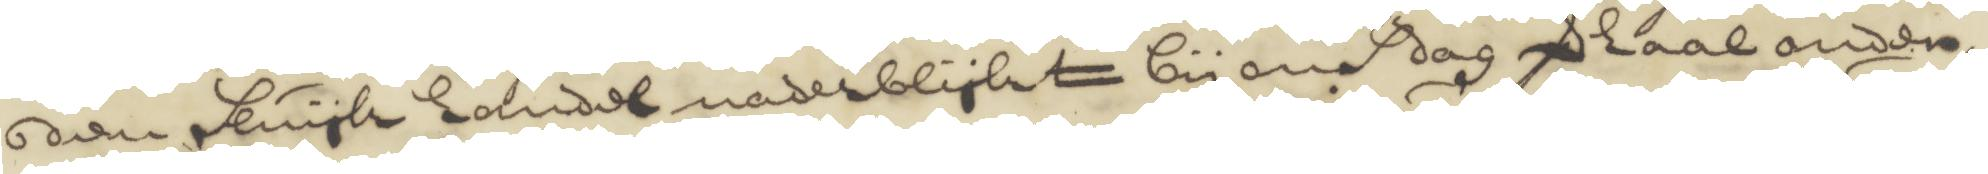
den sluijk handel naderblijkt bij ons dag verhaal onder
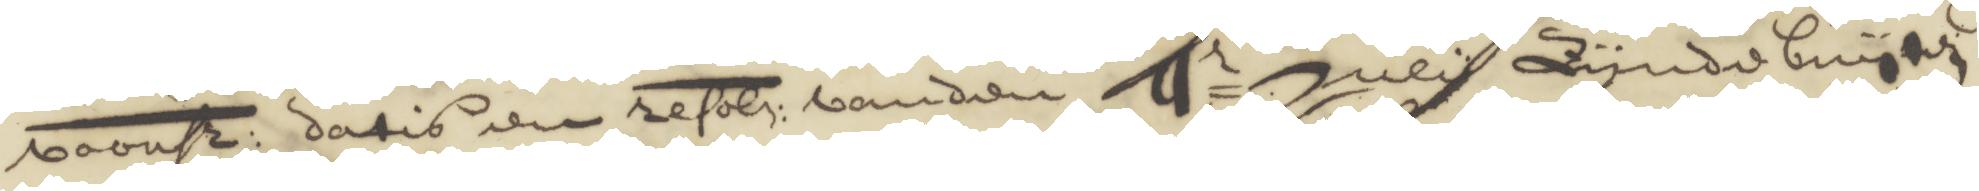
voorsz: datis en resol: van den 4=en Julij Zijnde buijten
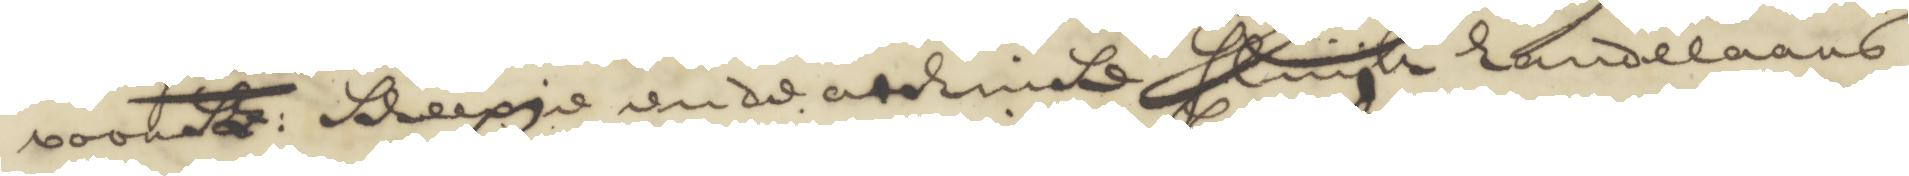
voorsz: Scheepje en de atchinse Sluijk handelaars
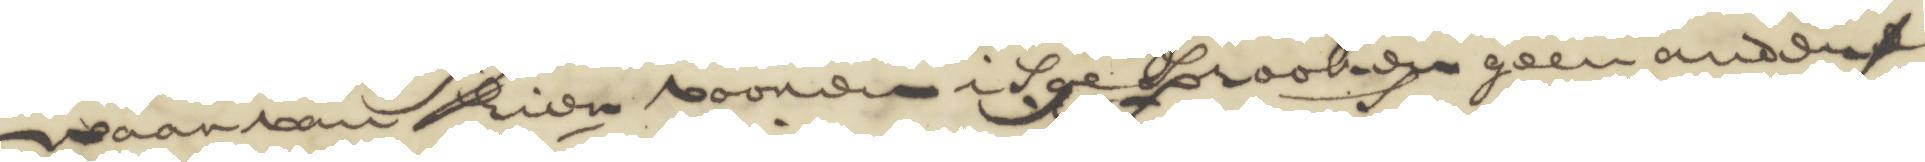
waar van hier vooren is gesprooken geen andere
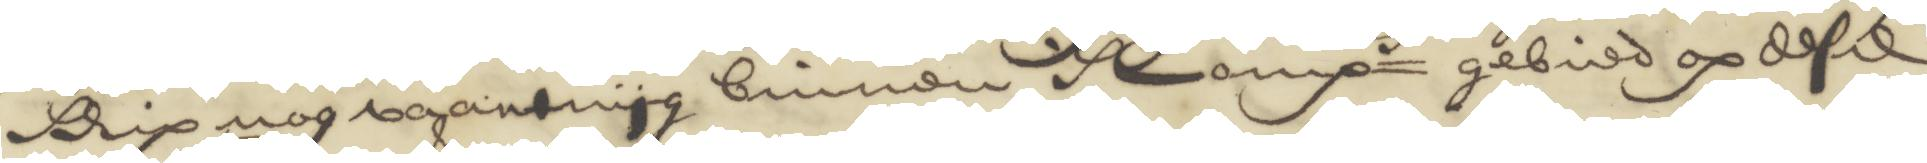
Schip nog vaartuijg binnen ’s Comp=s gebied op dese
